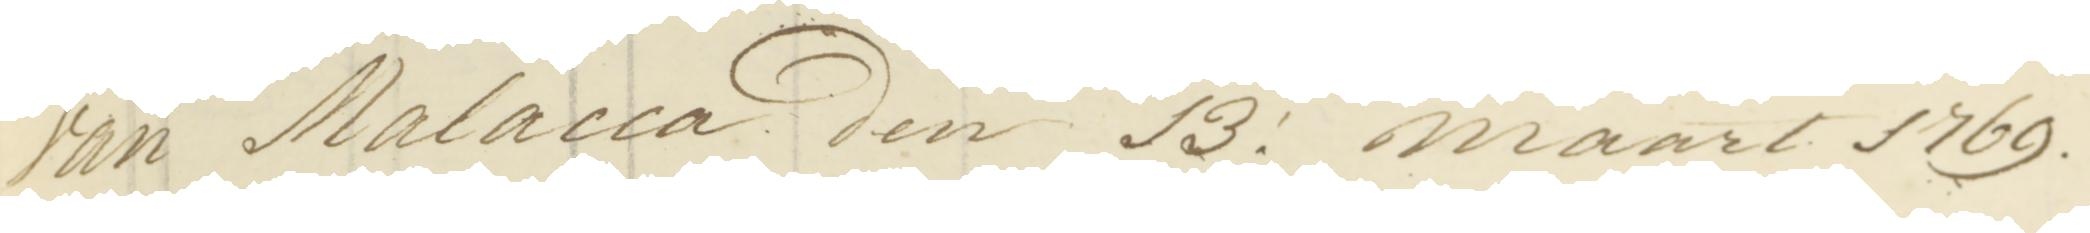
van Malacca den 13: maart 1769.
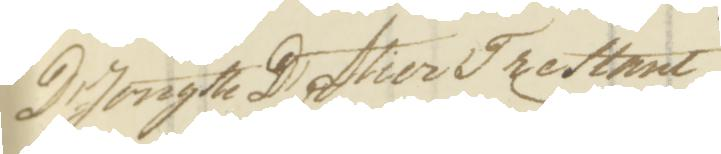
De Jongste De Hier T restant
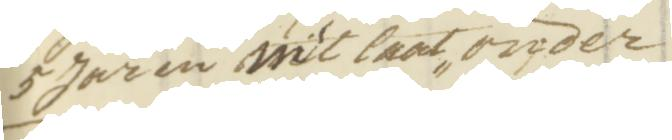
5 Jaren met laat, order
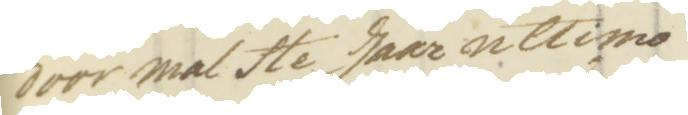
door mal ste Jaar ultimo
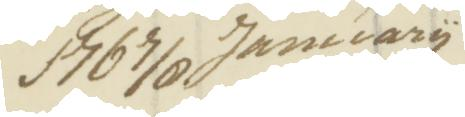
1767/8 Januarij
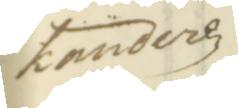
konderen
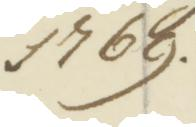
1769.
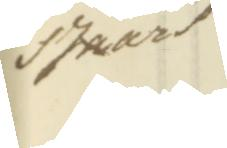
s jaars
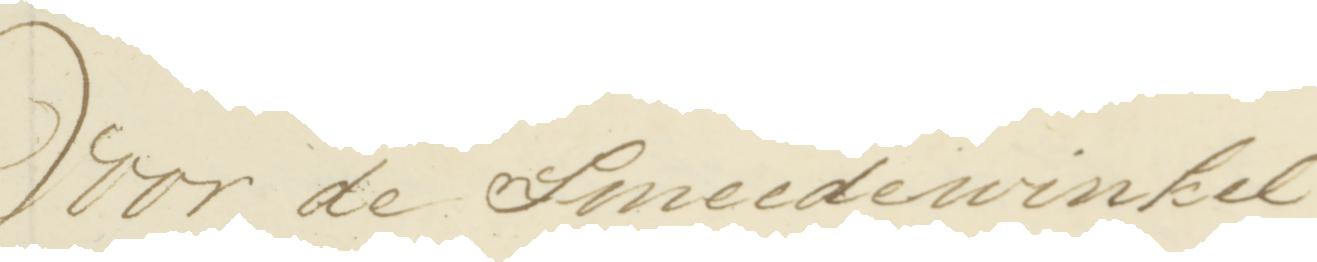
Voor de Smeedewinkel
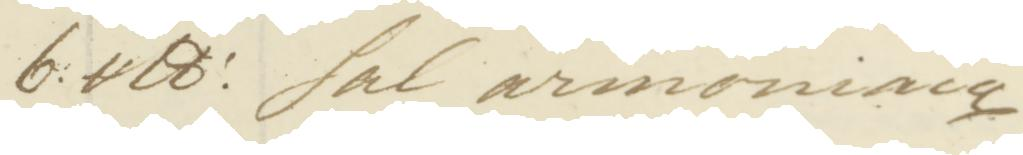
6: vlt: sal armoniacq
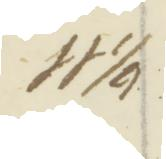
11¼
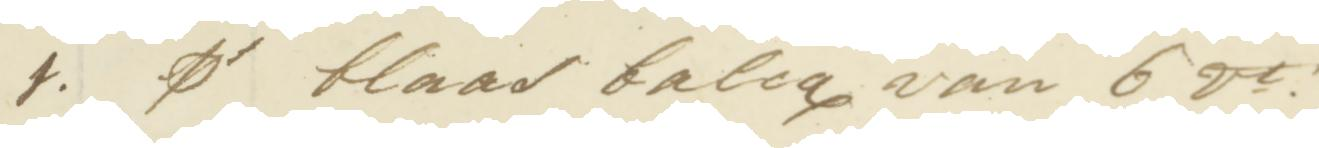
1: p.s blaas balcq van 6 v=t
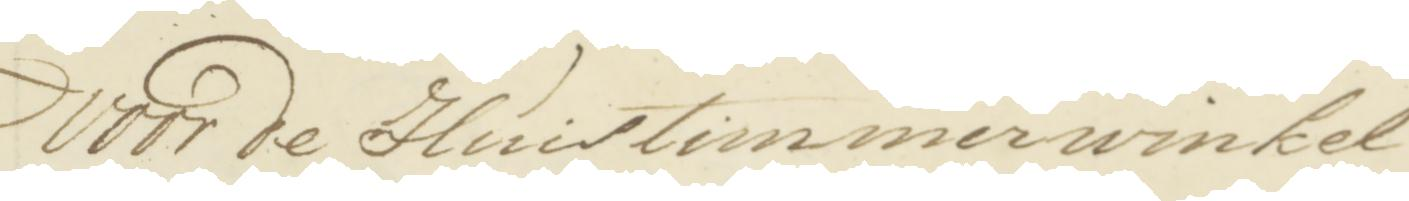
voor de Huistimmerwinkel
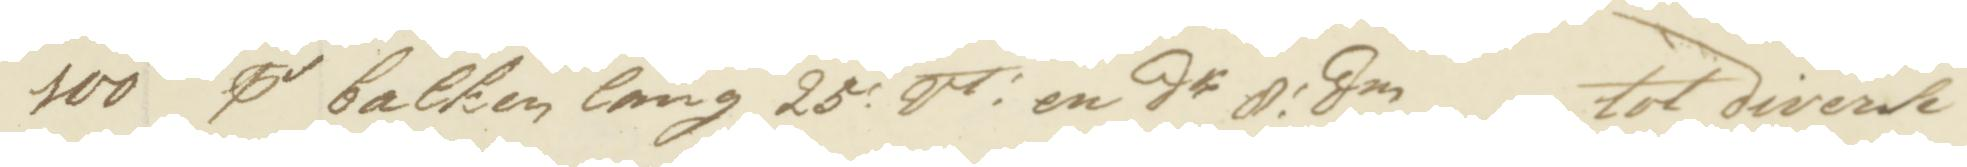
100 ps balken lang 25: V:t en d=o 8: dm tot diverse
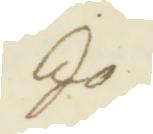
Jo
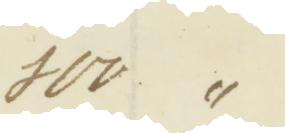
100 „
